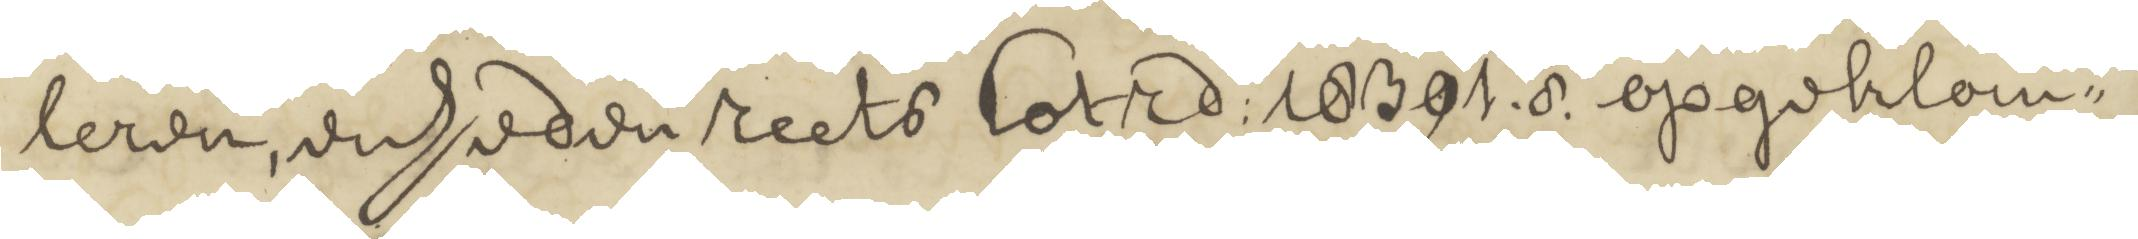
leren, en heden reets tot rd:s 18391.7/8. opgeklom„
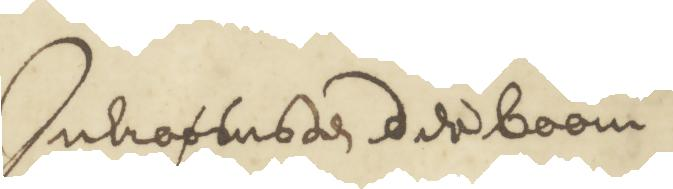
Jnkoomsten der boom
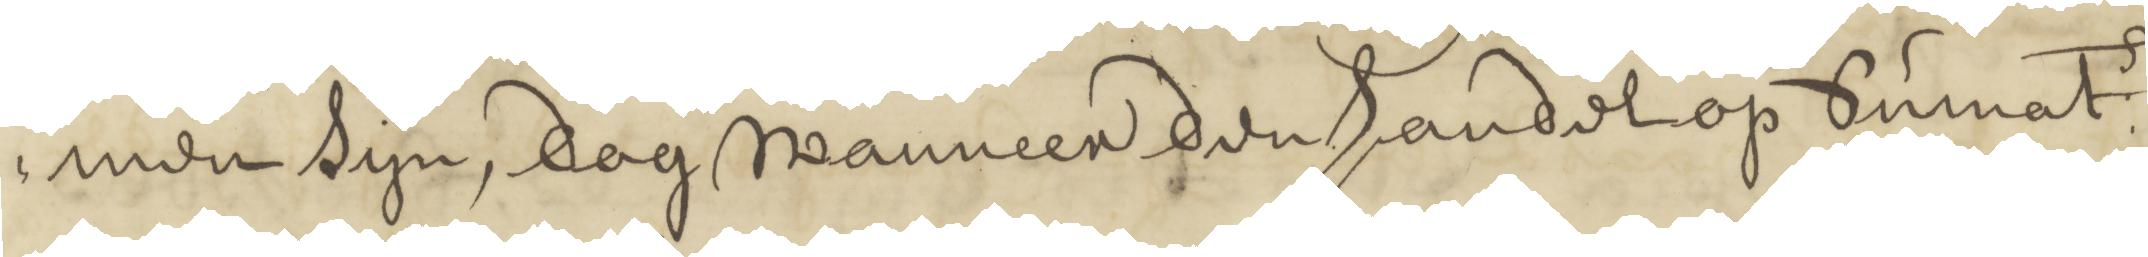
„men Sijn, dog wanneer den handel op Sumat:
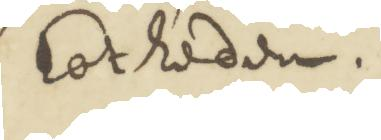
tot heden.
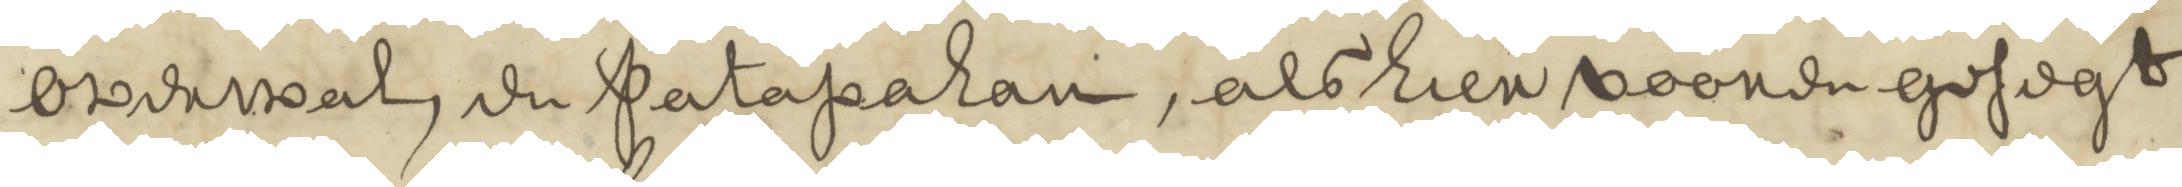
overwal, en Patapahan, als hier vooren gesegt
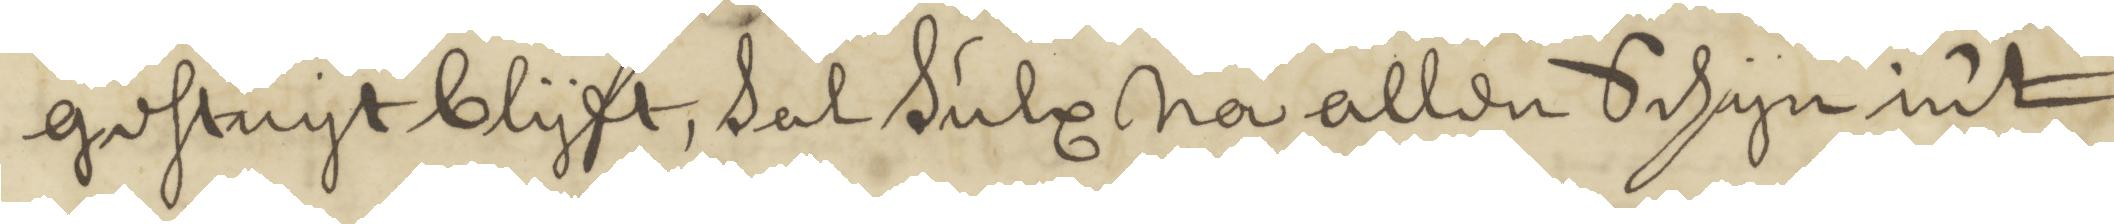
gestuijt blijft, sal sulx na allen schijn in ’t
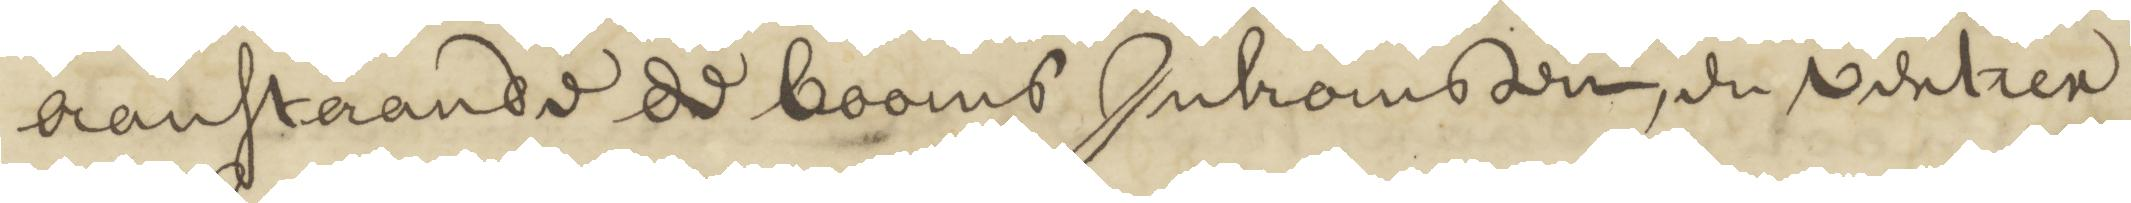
aanstaande de booms Jnkomsten, en vertier
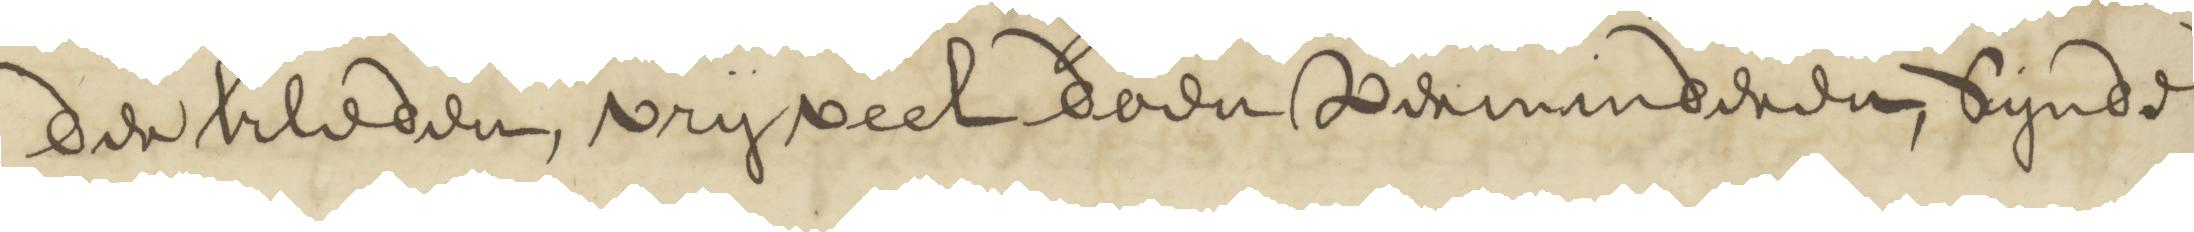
der kleden, vrij veel doen verminderen, sijnde
